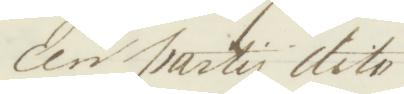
Een partij dito
